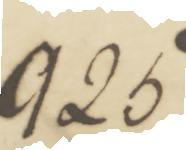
925
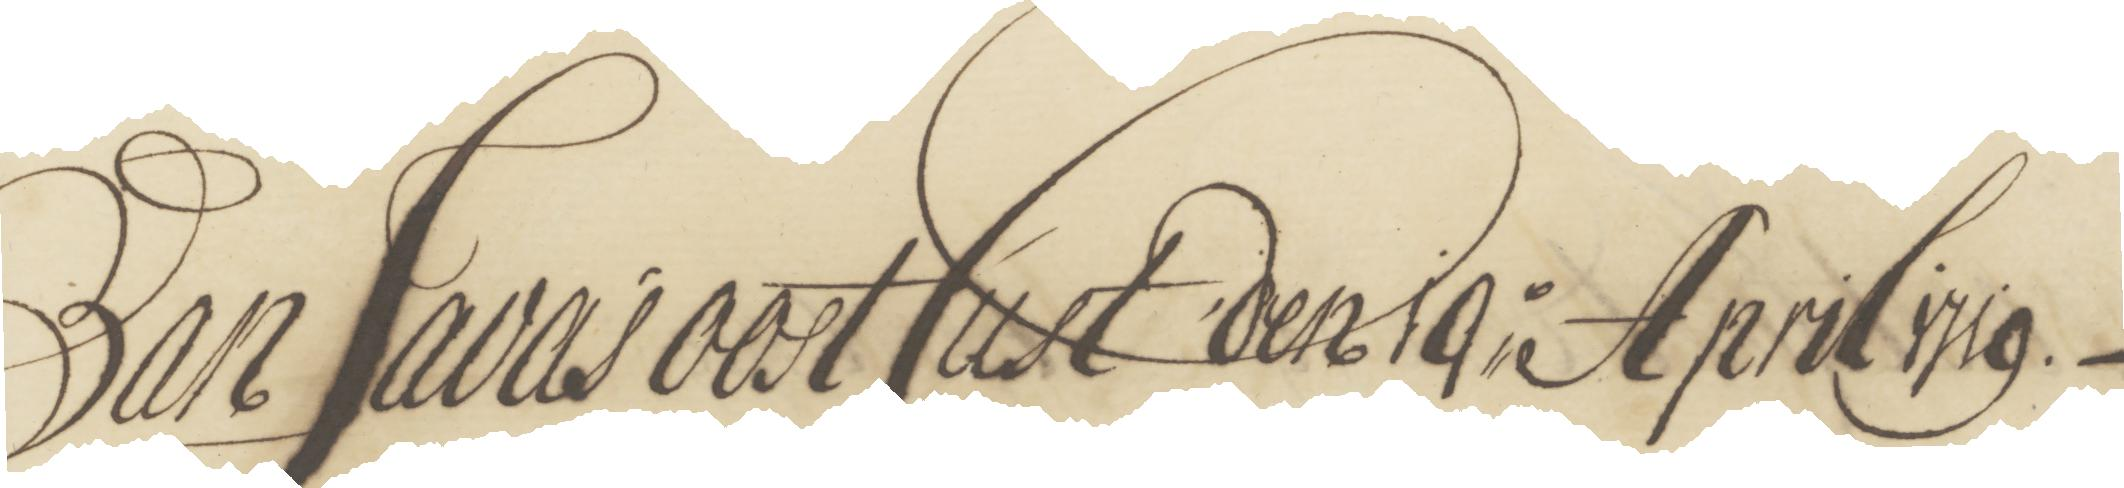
Van Java's oost Cust den 14„o April 1719. -
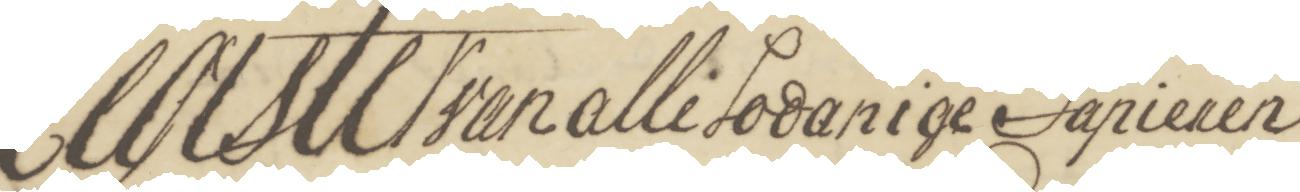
Register van alle sodanige Papieren
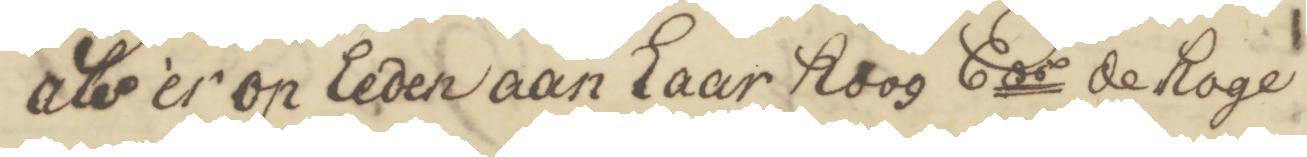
als 'er op hden aan haar Hoog Ed=s de hoge
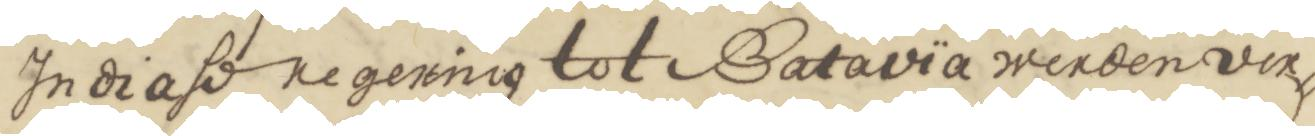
Jndiase regering tot Batavia werden ver
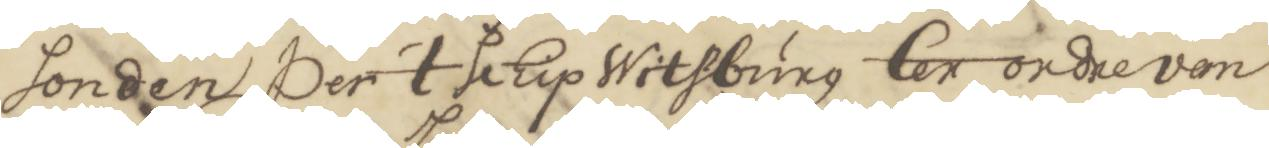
Sonden per ’t schip witsburg ter ordre van
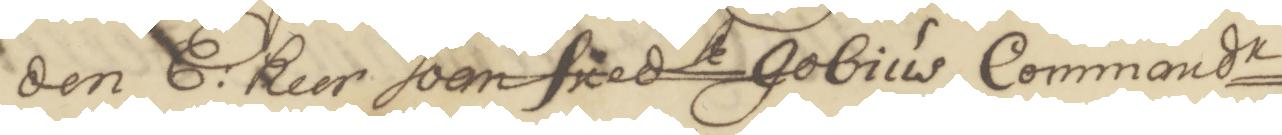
den E: heer Joan fred=k gobius Command=r
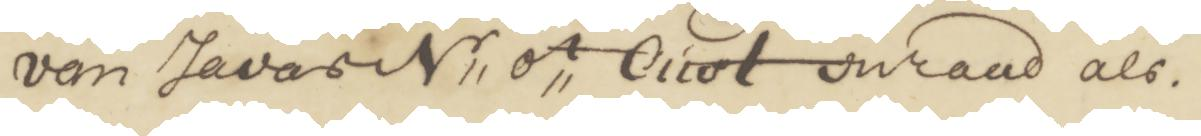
van Javas N„s o„t Cust en raad als.
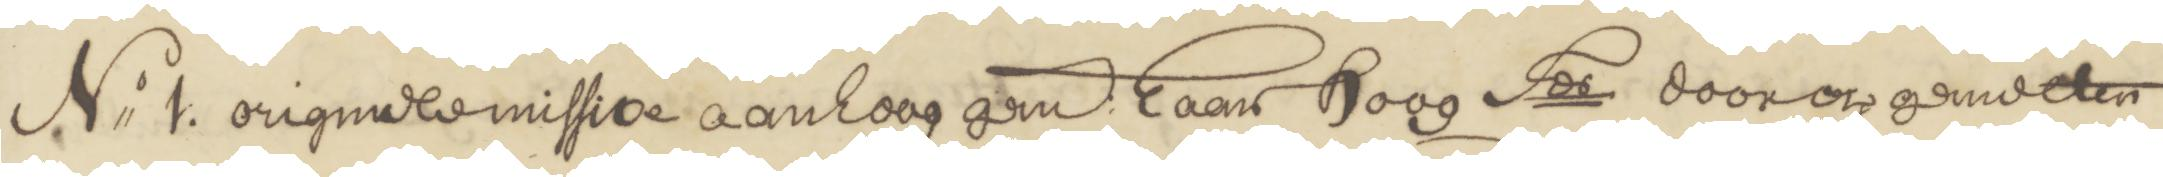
N„o 1. originele missive aan hoog gem: haar Hoog Ed=s door op gemelten
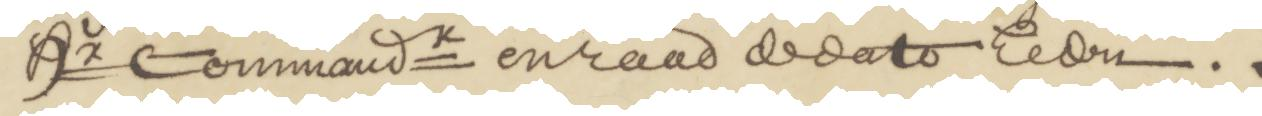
H=r command=r en raad de dato heden.
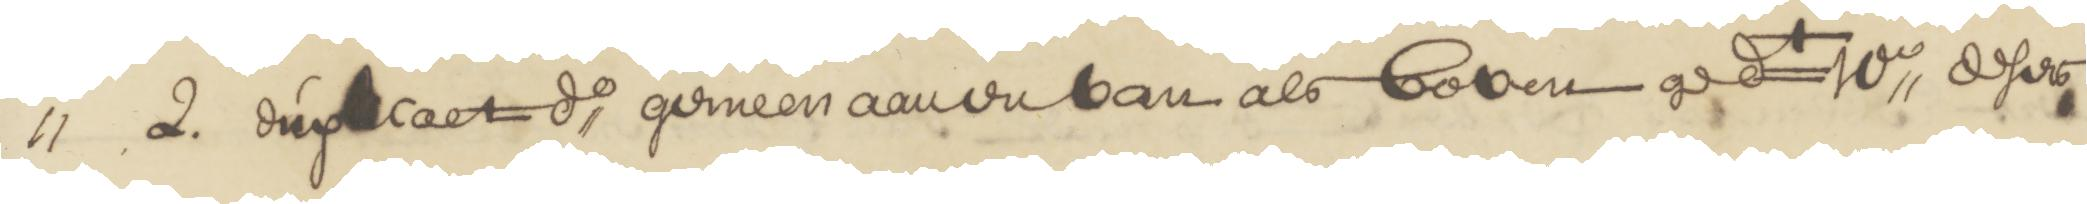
„ 2. duplicaet d„o gemeen aan en van als boven ged=t 10„e deses
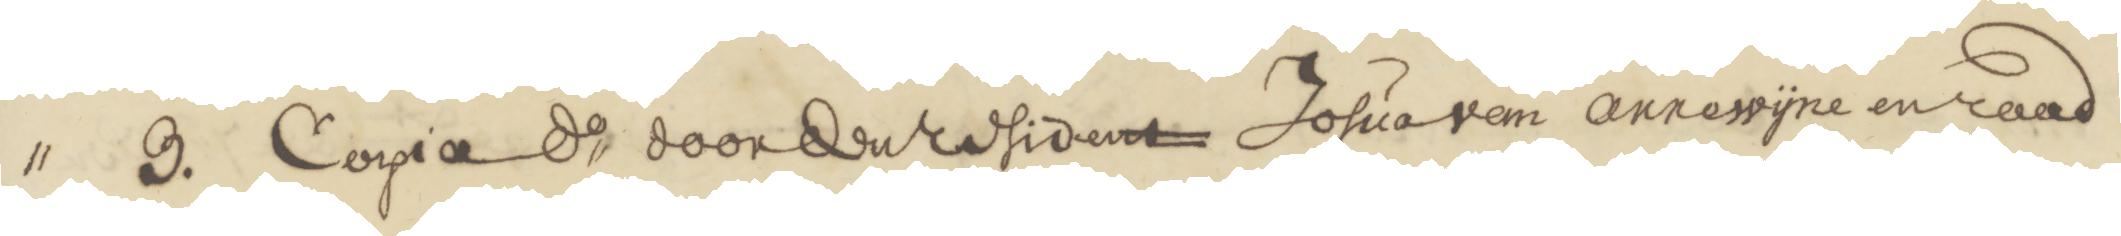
„ 3. Copia d„o door den resident Josua van arrewijne en raad
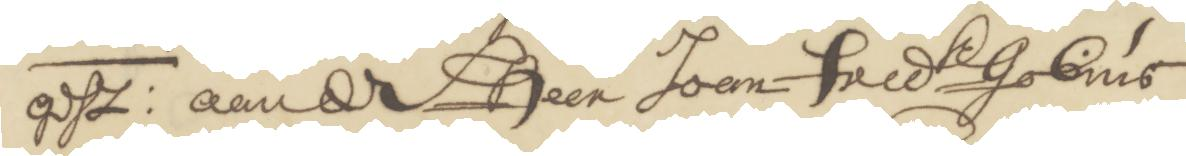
gesz: aan de E= Heer Joan fred=k Gobius
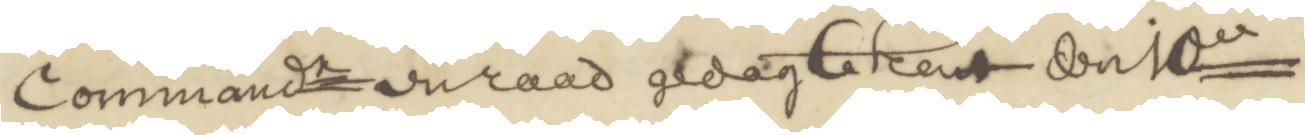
Command=r en raad gedagtekent den 10=en
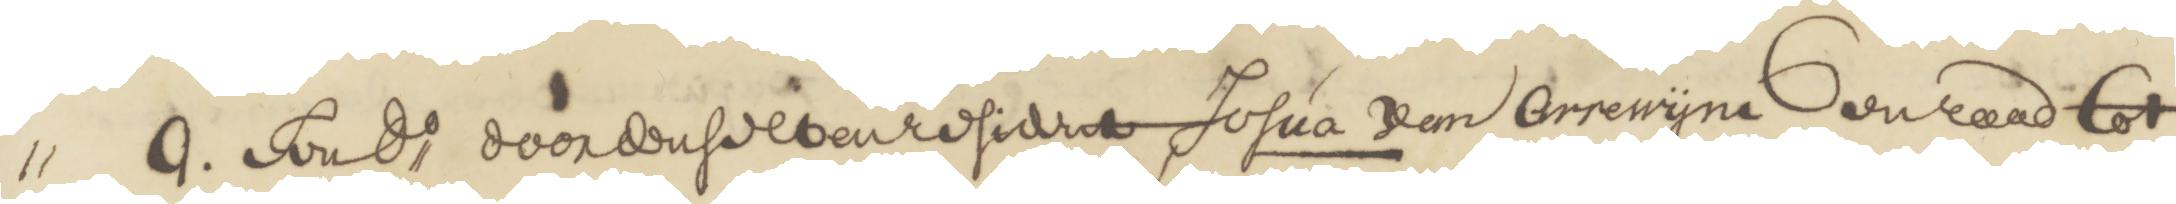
„ 4. Een d„o door denselven resident Josua van Arrewijne Den raad tot
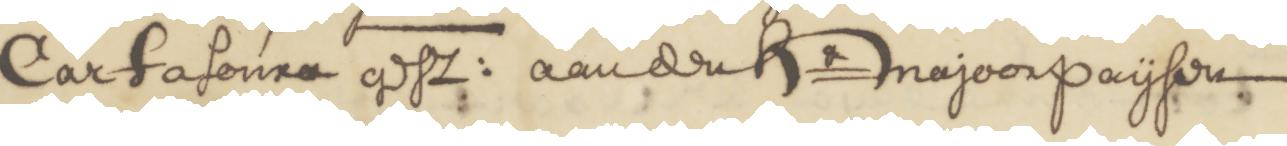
Cartasoura gesz: aan den H=r majoor paijsen
